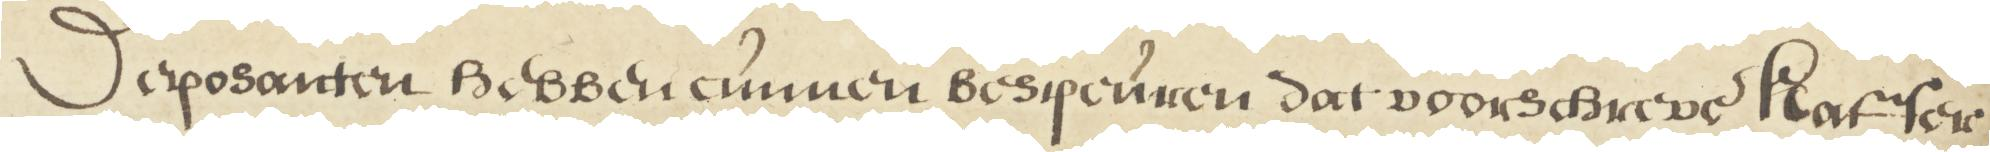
Deposanten hebben cunnen bespeuren dat voorschreve Kaster
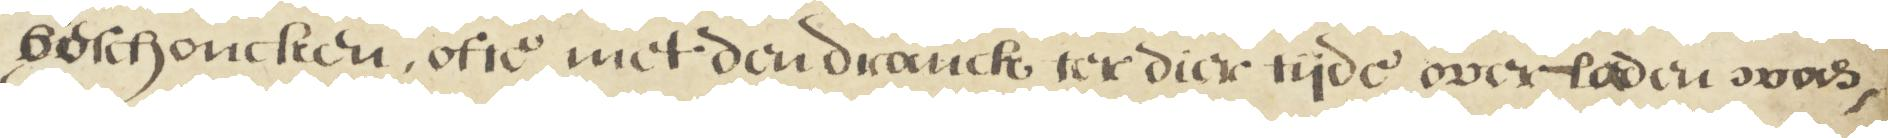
beschoncken, ofte met den dranck ter dier tijde overladen was,
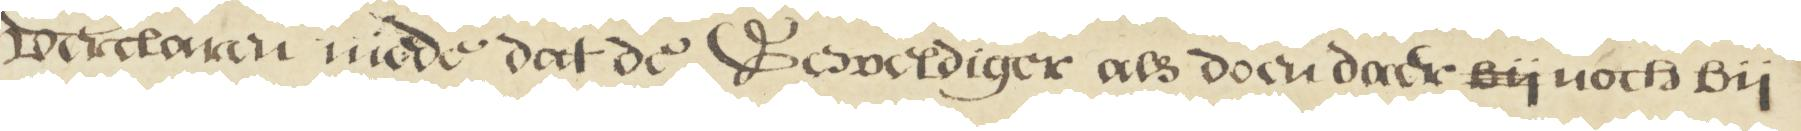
verclaren mede dat de Geweldiger als doen daer bij noch bij
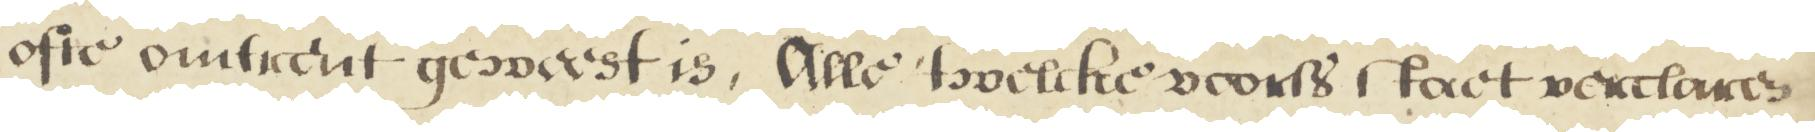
ofte omtrent geweest is, Alle 'twelcke voorsz staet verclaren
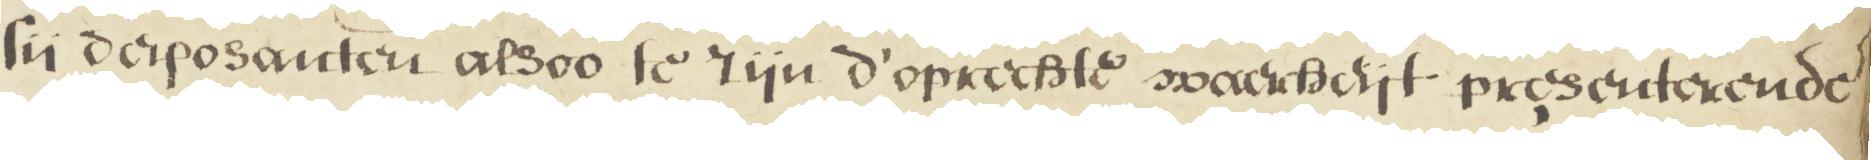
sij deposanten alsoo te zijn d’oprechte waerheijt presenterende
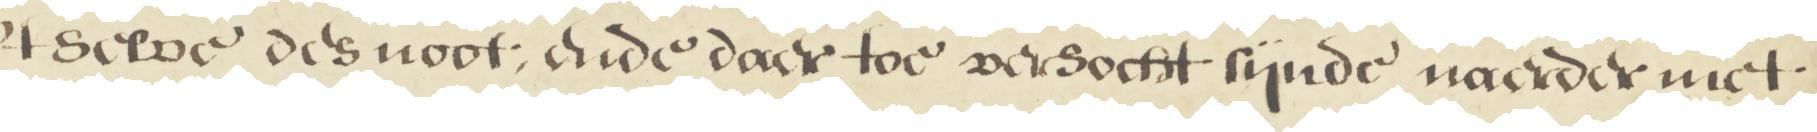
’t selve des noot, ende daer toe versocht sijnde naerder met
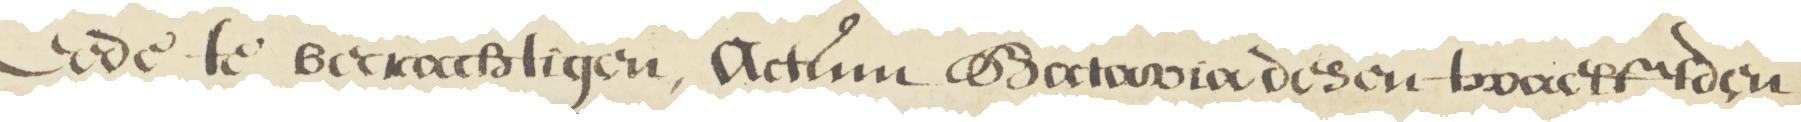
Eede te becrachtigen, Actum Batavia desen twaelfden
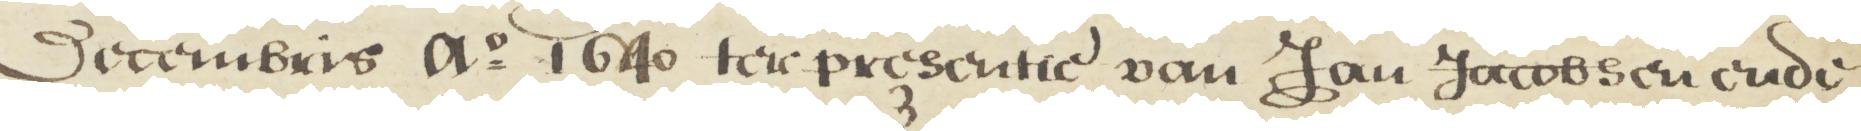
Decembris A=o 1640 ter presentie van Jan Jacobsen ende
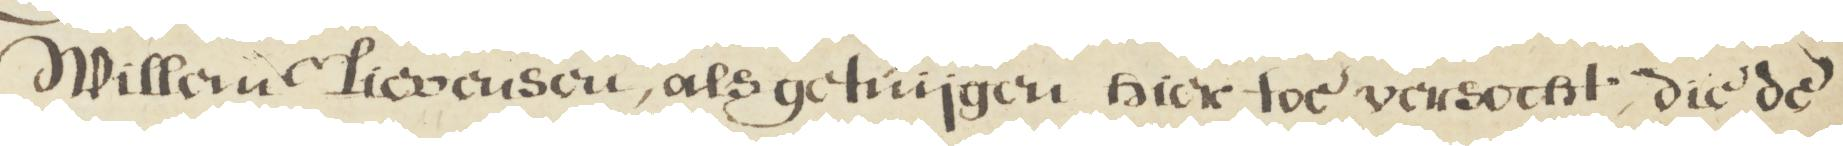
Willem Lievensen, als getuijgen hier toe versocht, die de
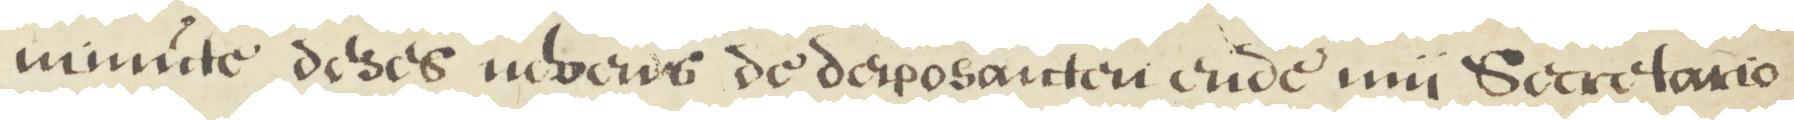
minute deses nevens de deposanten ende mij Secretario
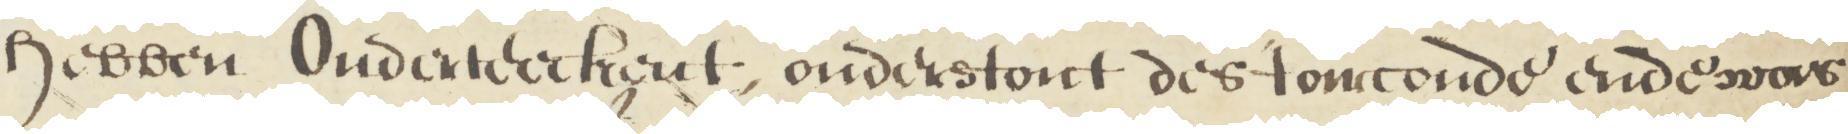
Hebben Onderteeckent, onderstont des toirconde ende was
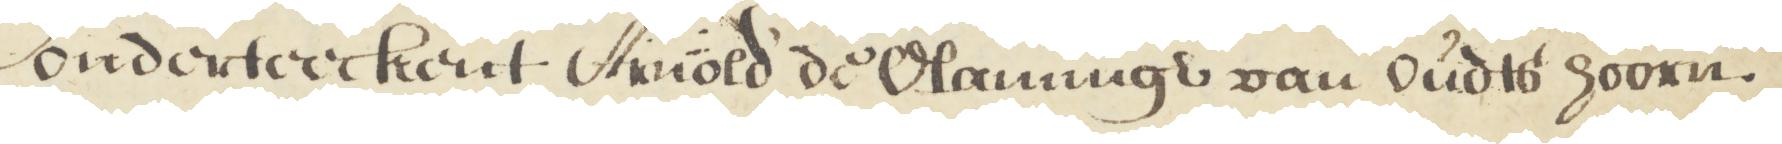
onderteeckent Arnold de Vlamingh van Oudts hoorn.
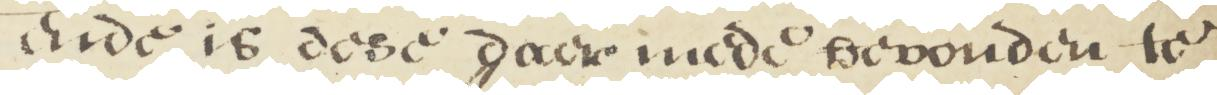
ende is dese daer mede bevonden te
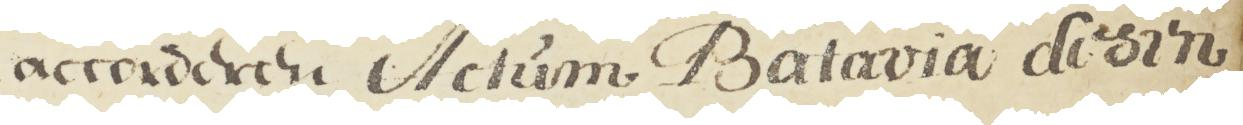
accorderen Actum Batavia desen
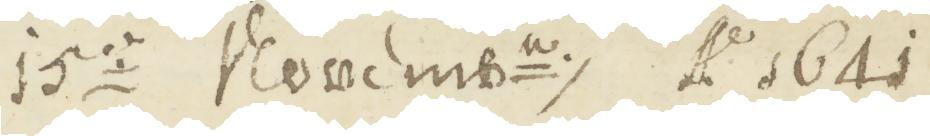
15=e. Novemb=r A:o 1641
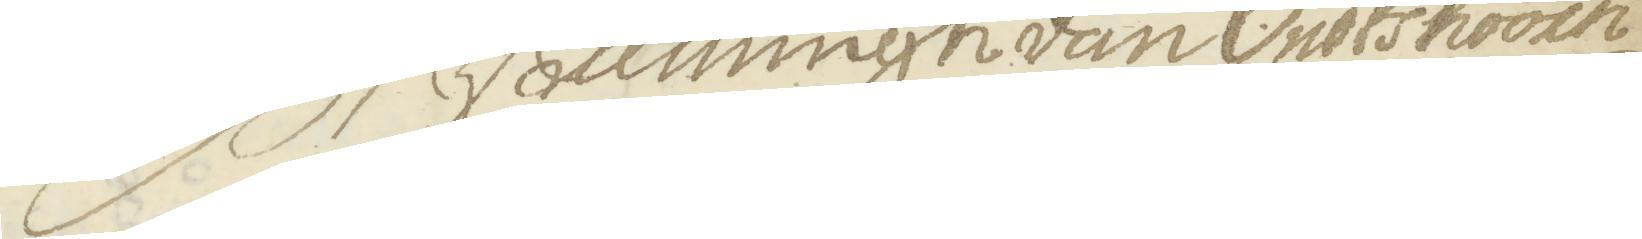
A. Vlamingh van Oudtshoorn
